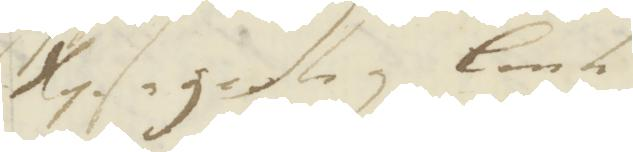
Vyfenzestig Cent
